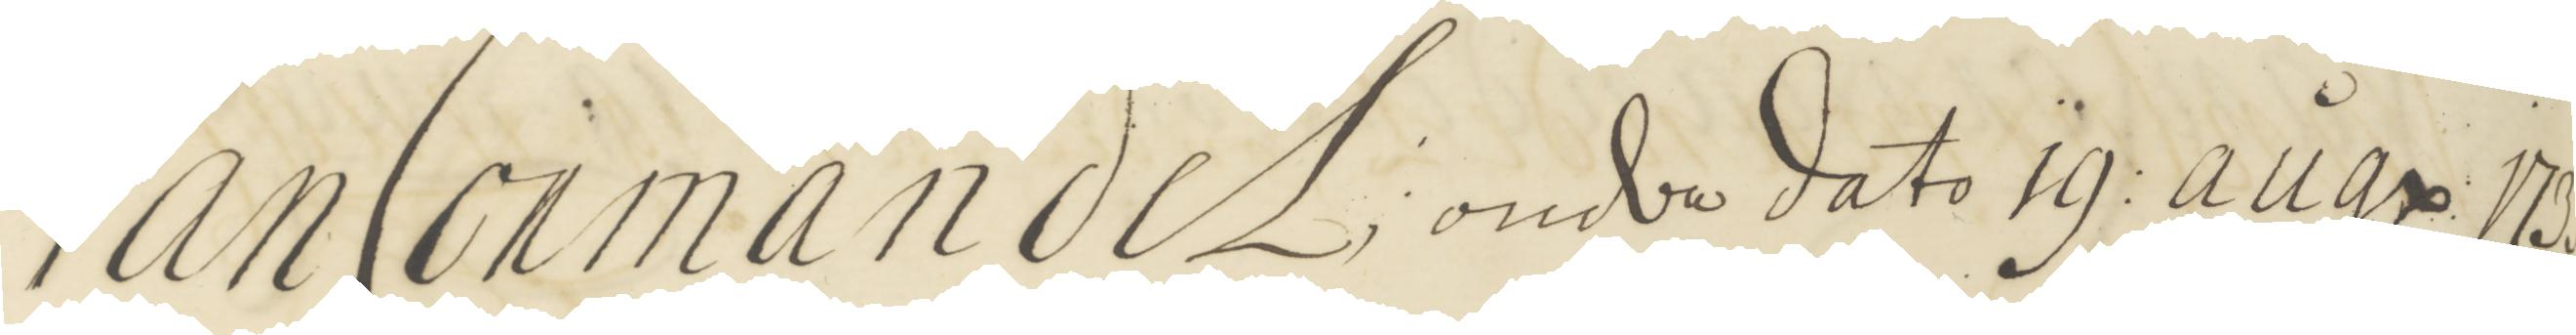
Van Cormandel; onder dato 19: augx: 173
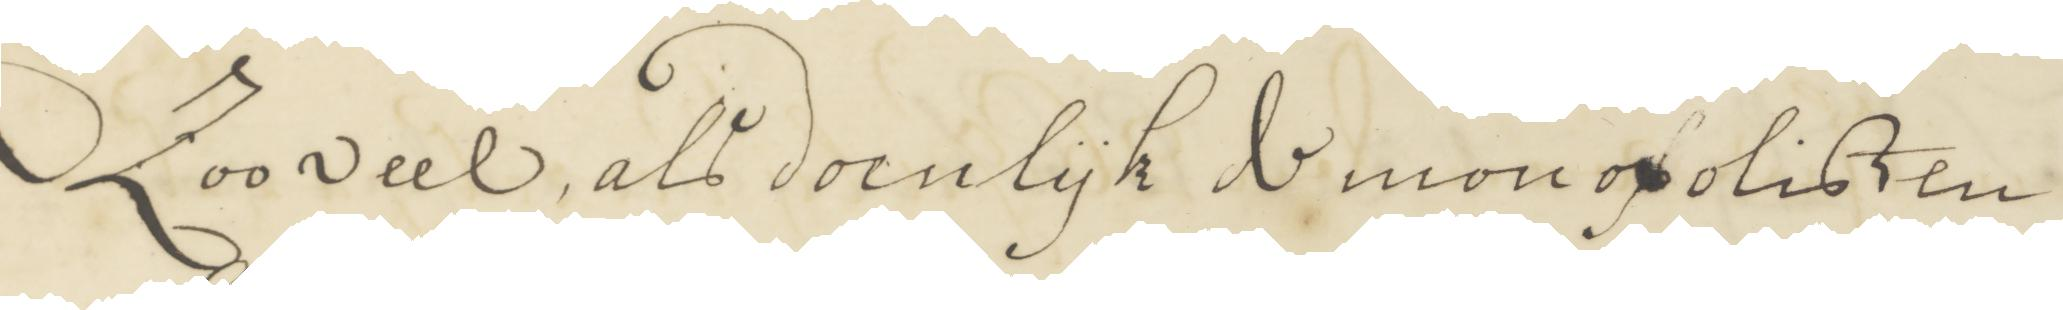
Zoo veel, als doenlijk de monopolisten
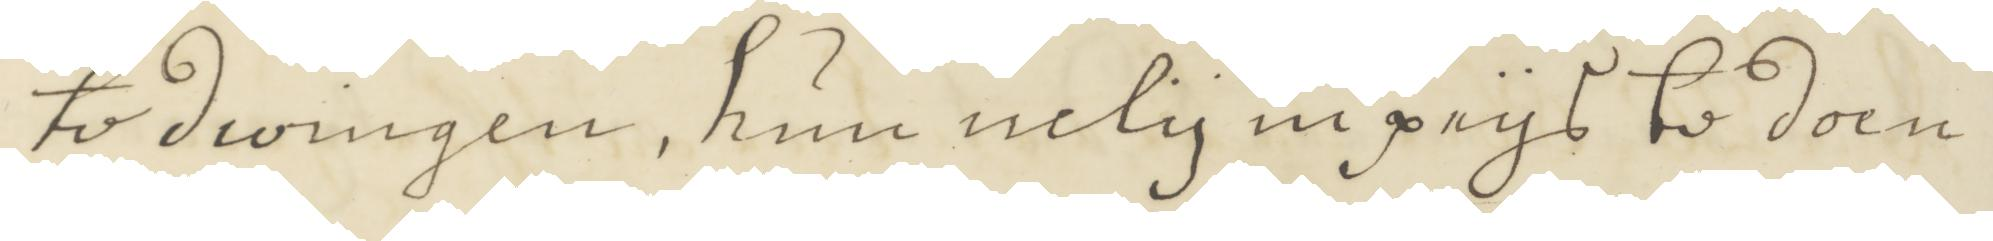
te dwingen, hun inlij in prijs te doen
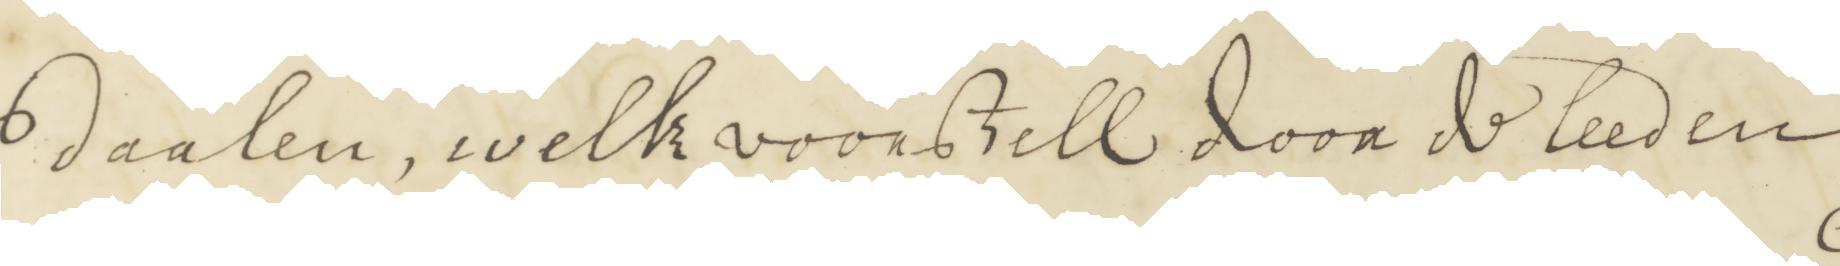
daalen, welk voorstell door de leeden
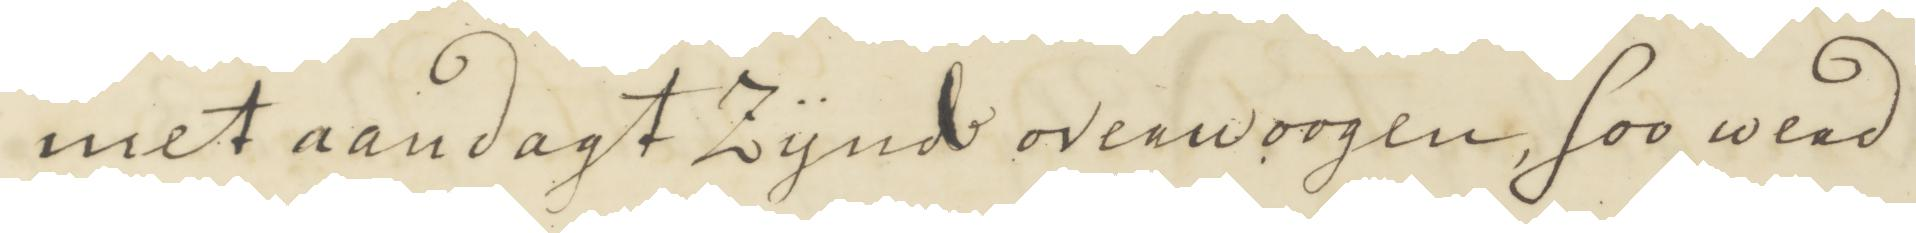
met aandagt zijnde overwoogen, soo werd
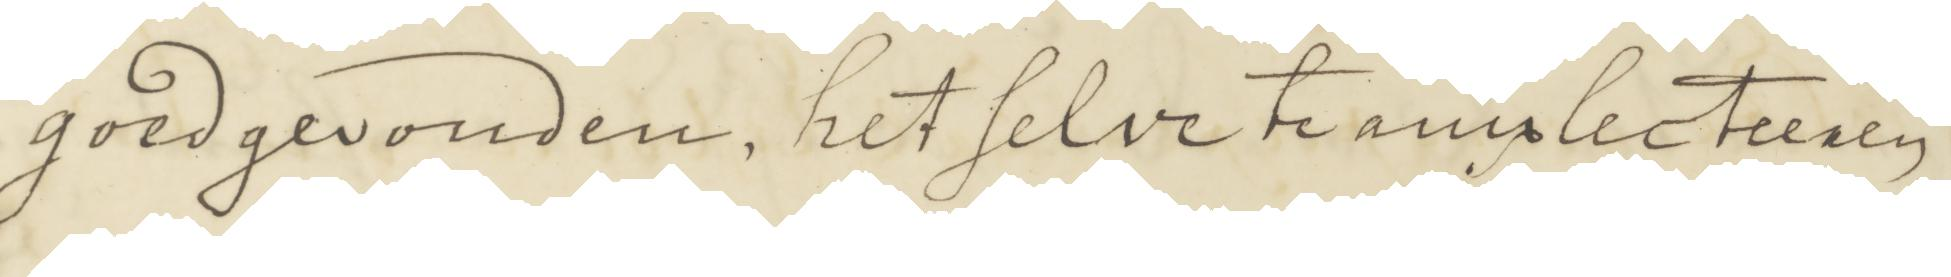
goedgevonden, het selve te amplecteeren
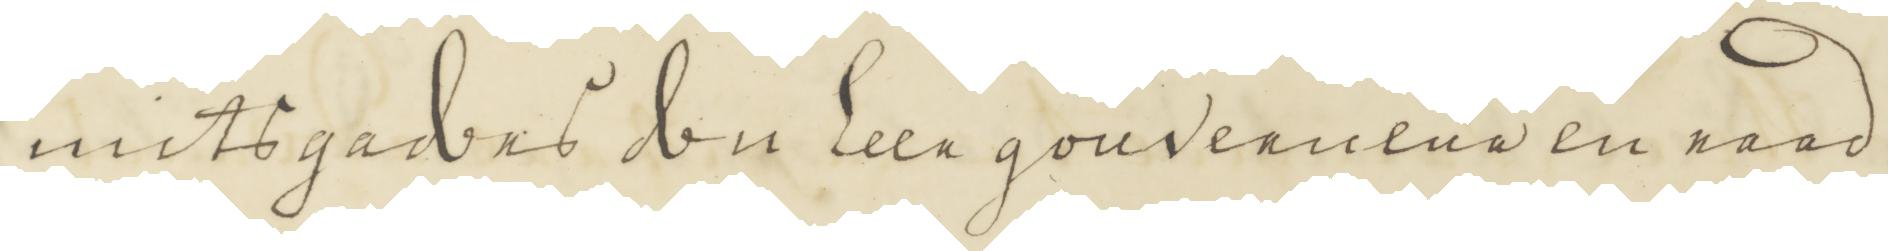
mitsgaders den heer gouverneur en raad
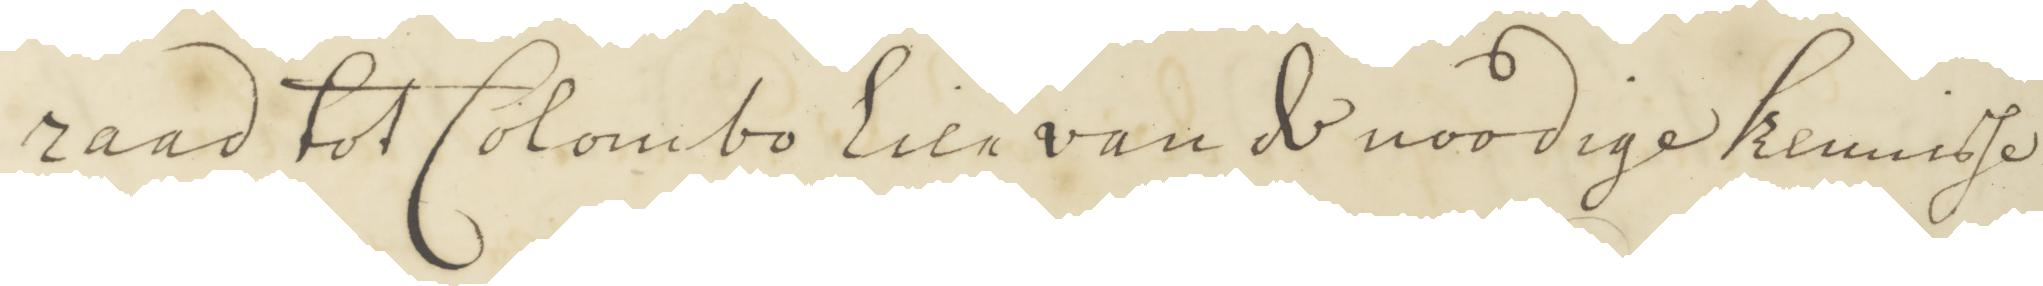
raad tot Colombo hier van de noodige kennisse
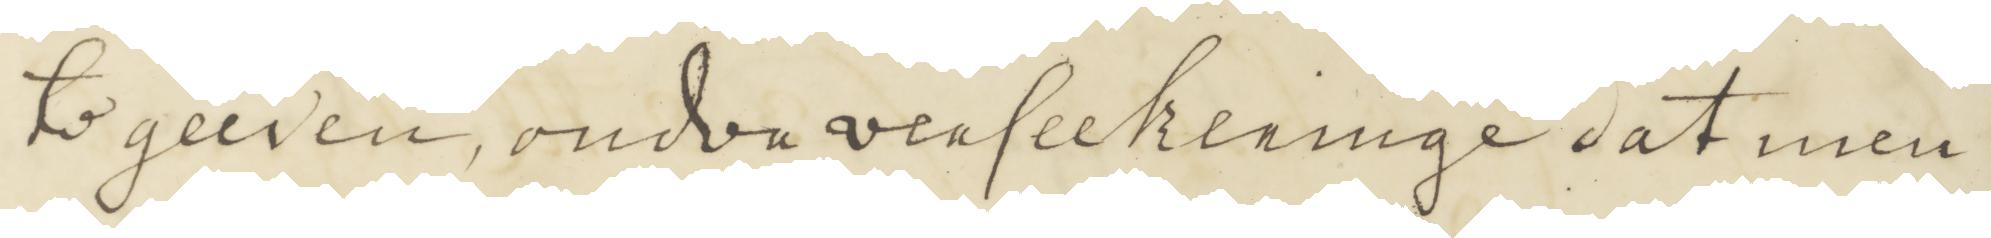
te geeven, onder verseekeringe dat men
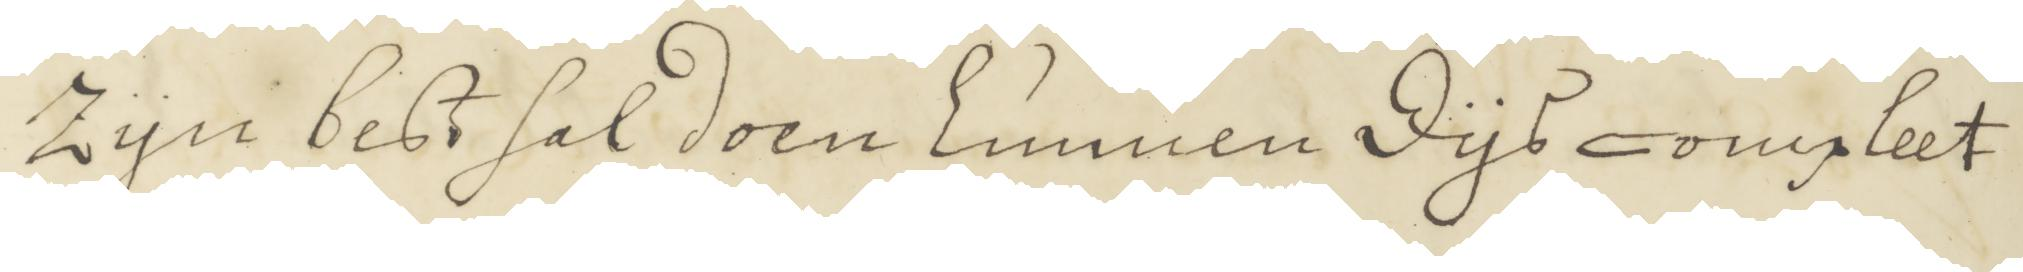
zijn best sal doen hunnen Eijs compleet
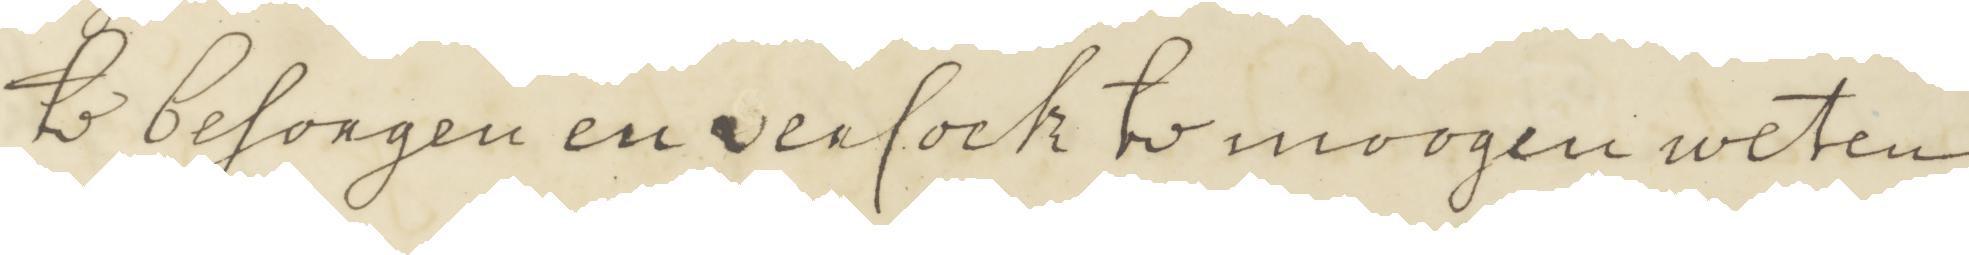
te besorgen en versoek te moogen weten
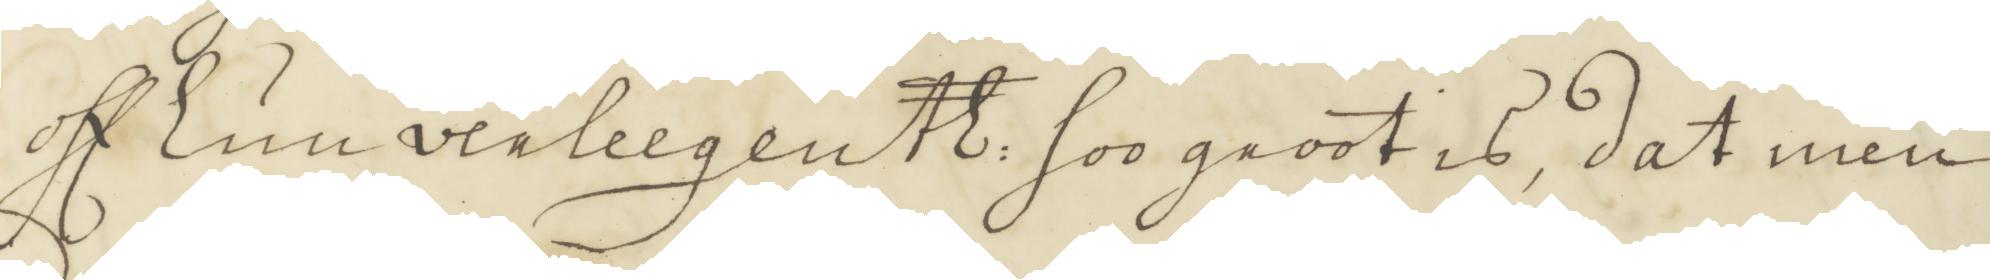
off hun verleegenth: soo groot is, dat men
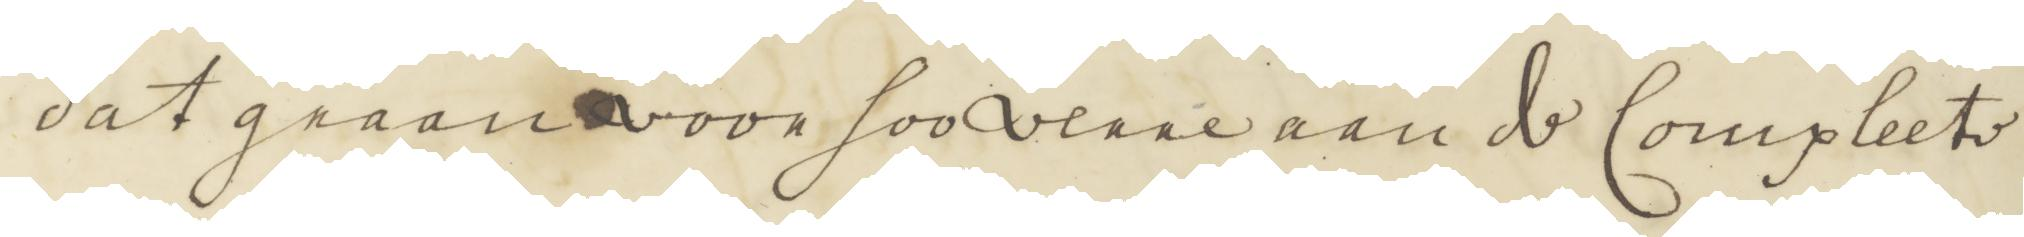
dat graan voor soo verre aan de Compleete
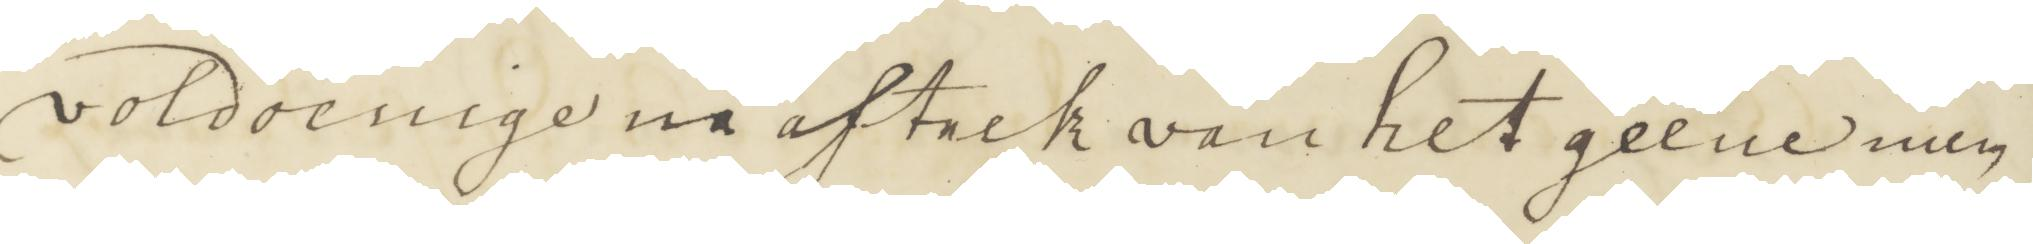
voldoenige na aftrek van het geene men
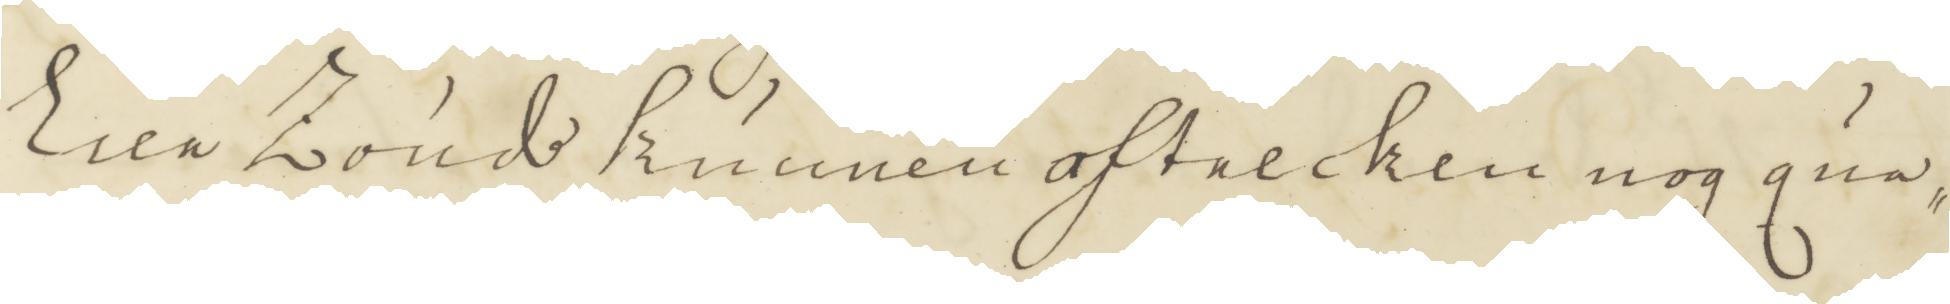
hier zoude kunnen aftrecken nog qua
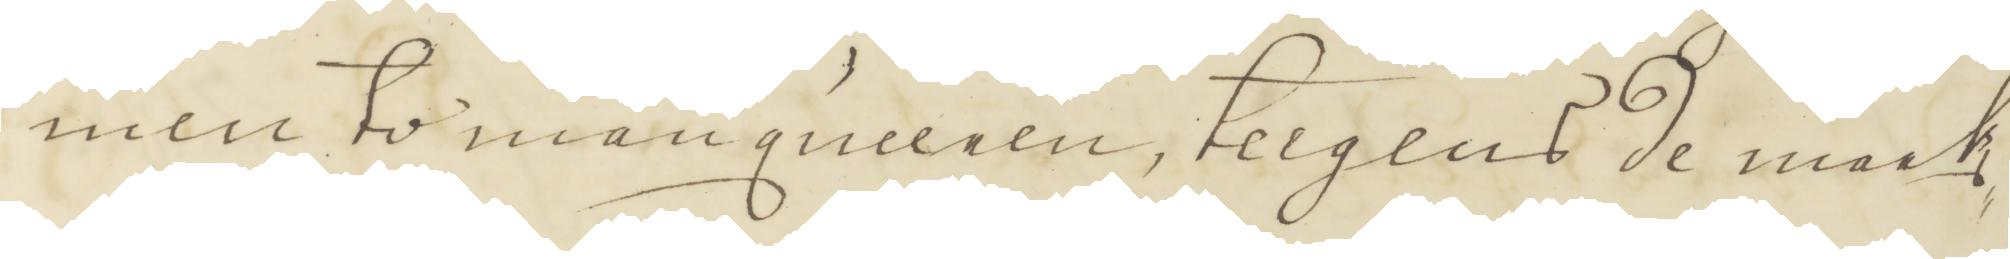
men te manqueeren, teegens de mark
